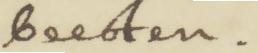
beesten.
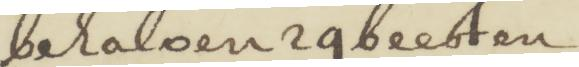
behalven 24 beesten
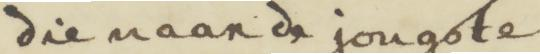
die naar de jongste
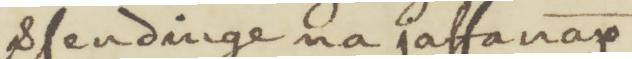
versendinge na jaffanap
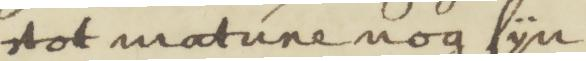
tot mature nog sijn
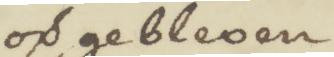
over gebleven
